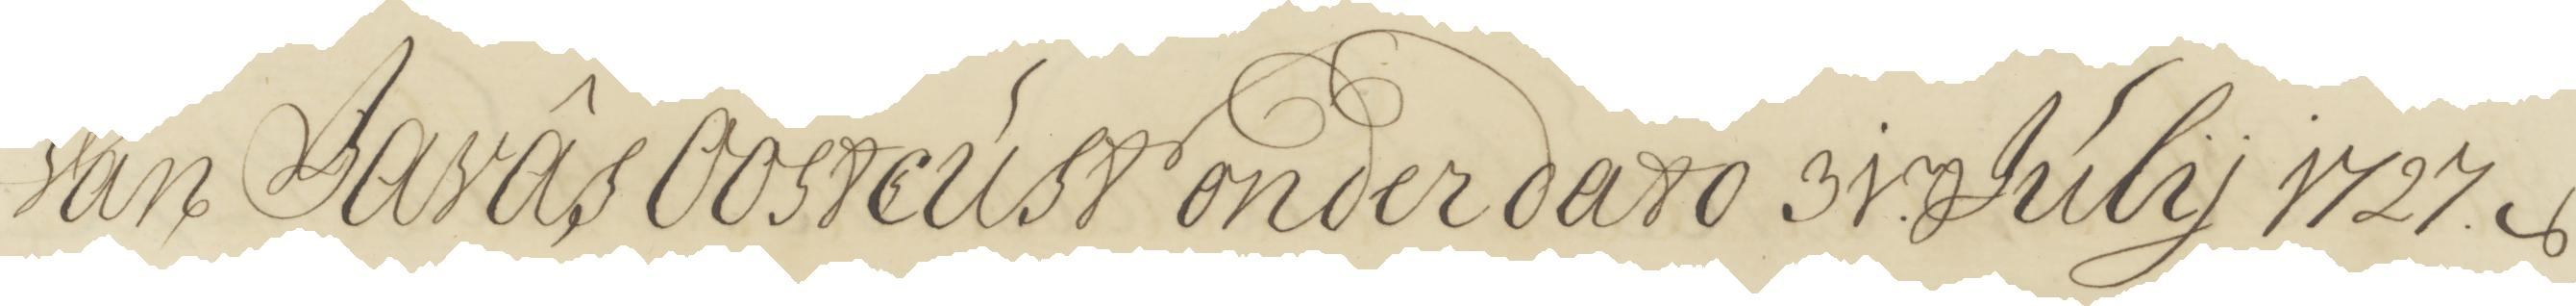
Van Javâs Oostcust onder dato 31:e Julij 1727. —
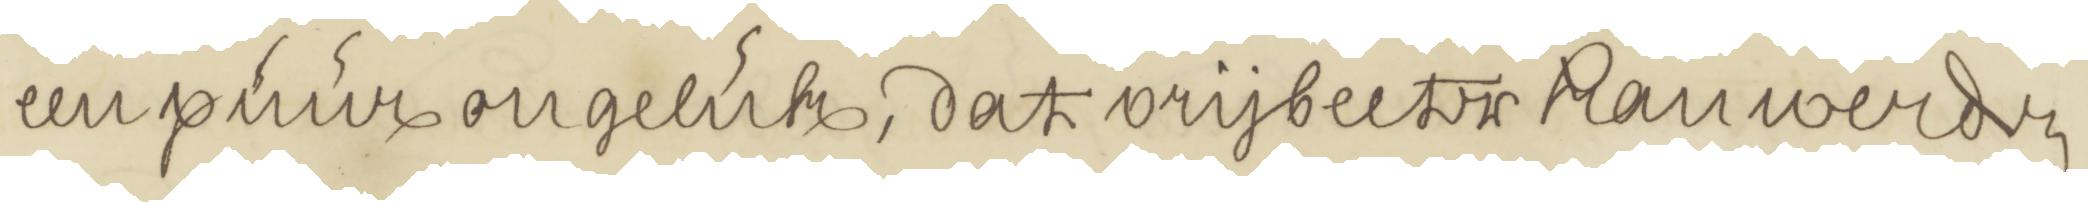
een puur ongeluk, dat vrijbeeter kan werden
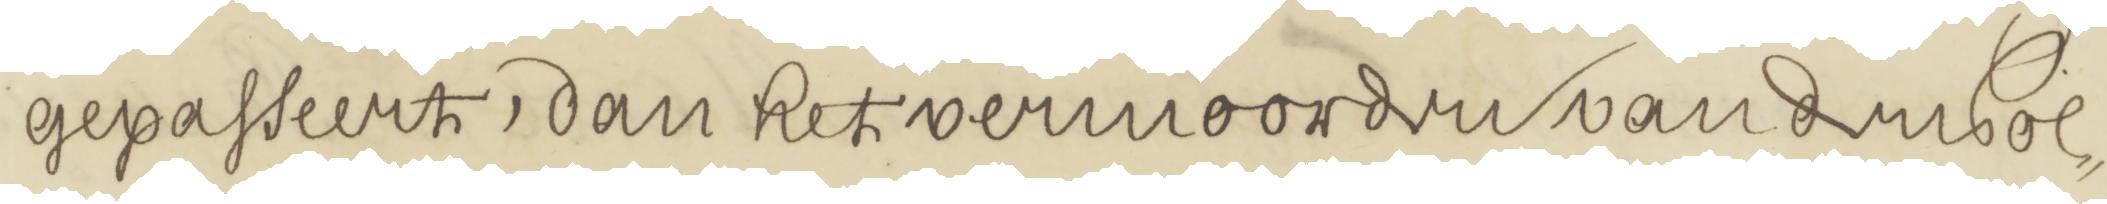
gepasseert, dan het vermoorden van densol„
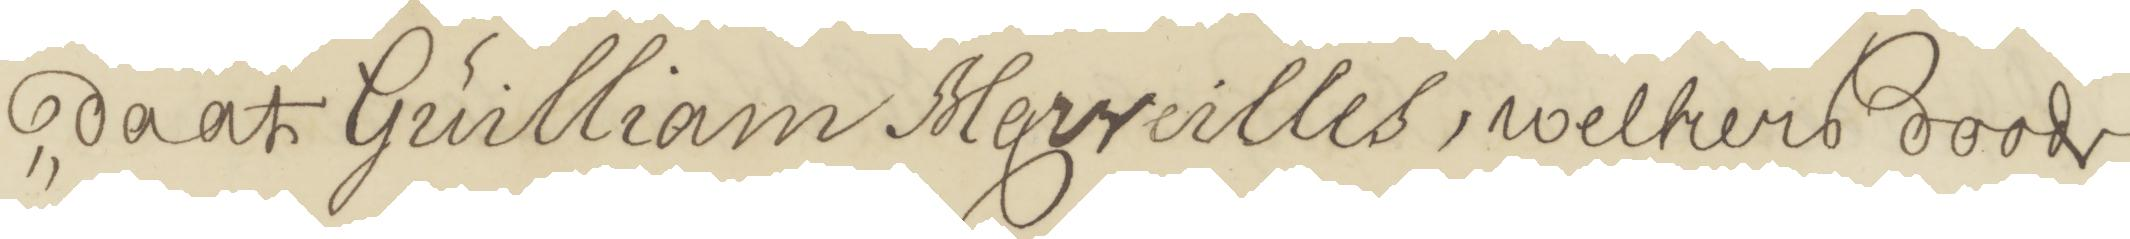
„daat Guilliam Merveilles, welkers doode
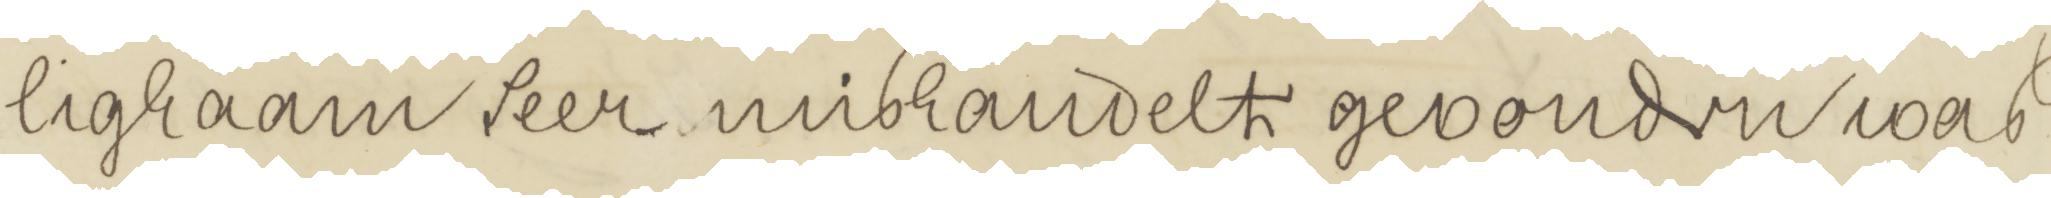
lighaam seer mishandelt gevonden was
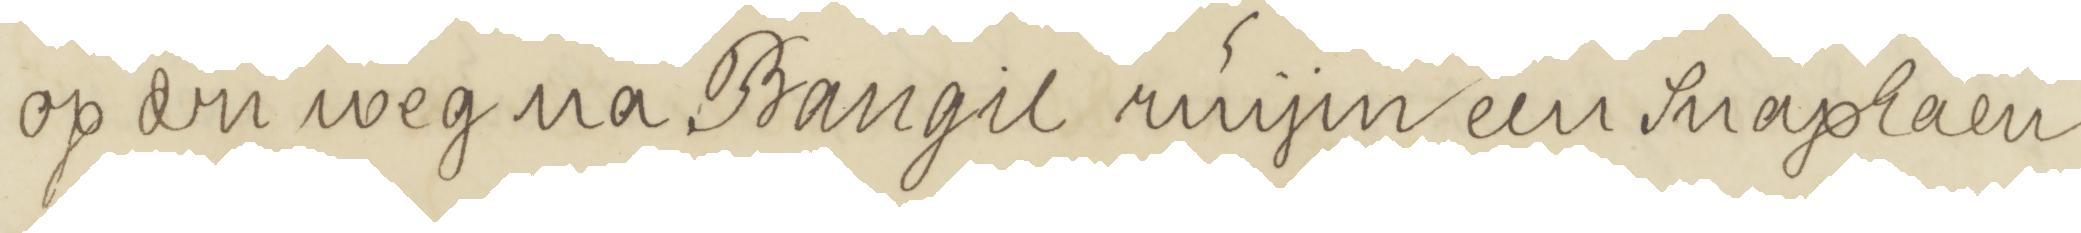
op den weg na Bangil ruijm een snaphaen
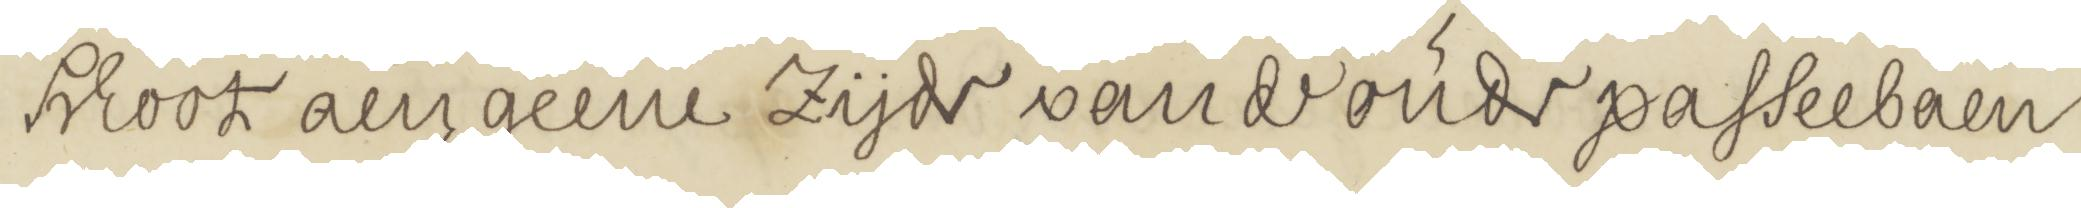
schoot aen geene zijde van de oude passeebaen
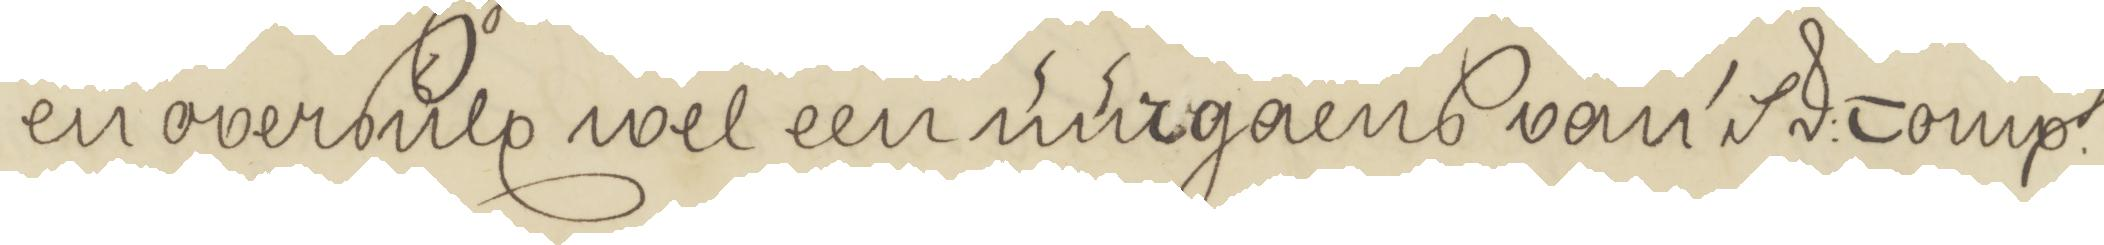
en oversulx wel een uur gaens van 'sE: comp:s
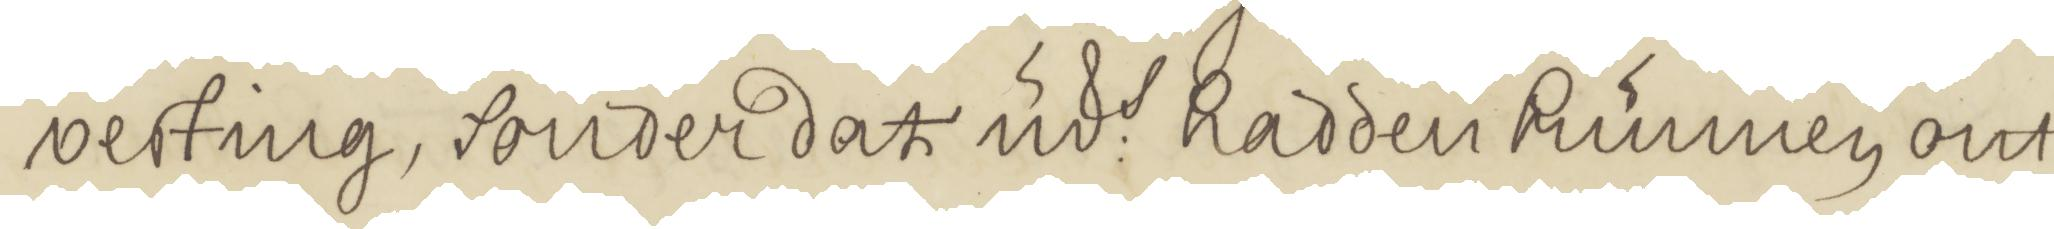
vesting, sonder dat uE:s hadden kunnen ont
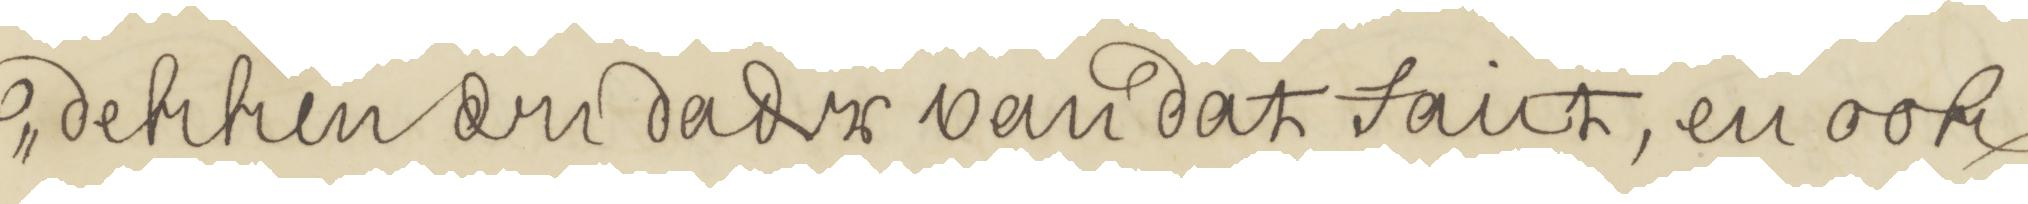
„dekken den dader van dat faict, en ook
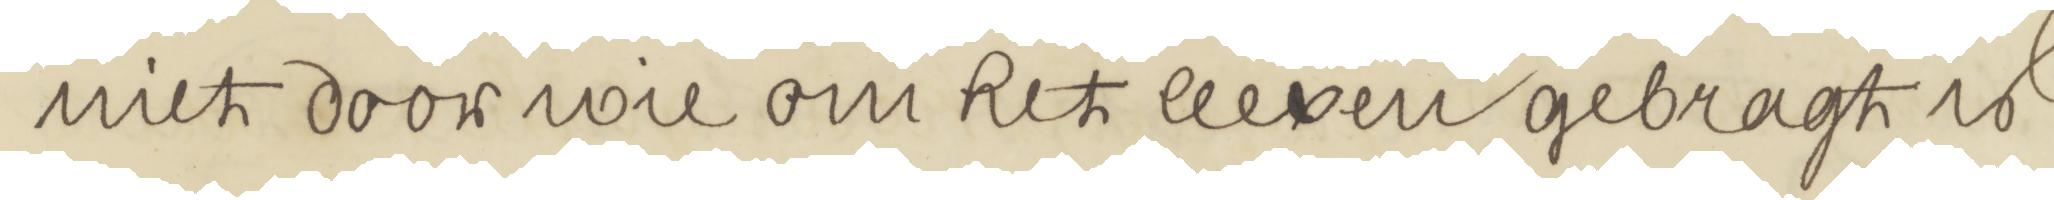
niet door wie om het leeven gebragt is
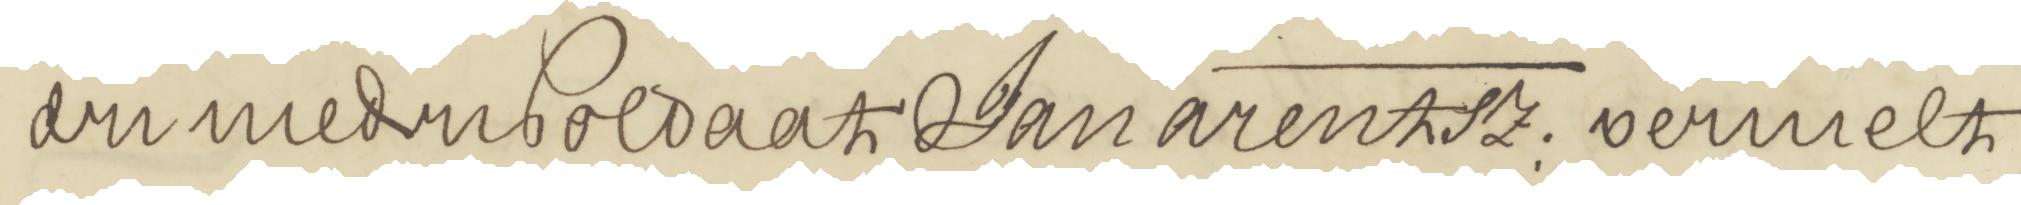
den medensoldaat Ian arentsz: vermelt
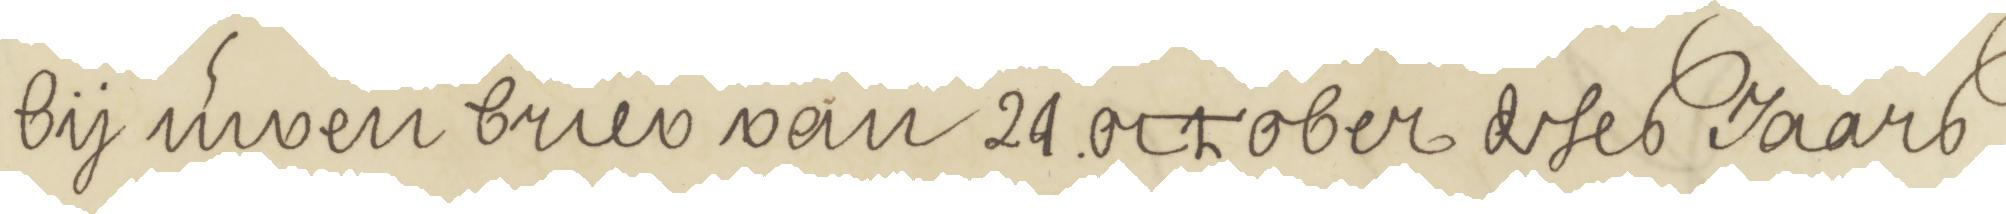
bij uwen briev van 24. october deses Iaars,
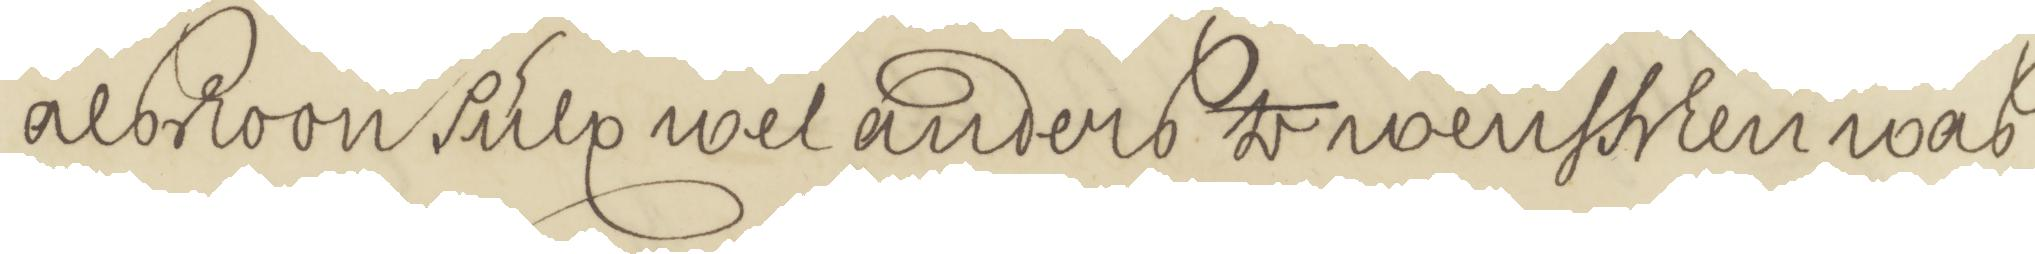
alschoon sulx wel anders te wenschen was,
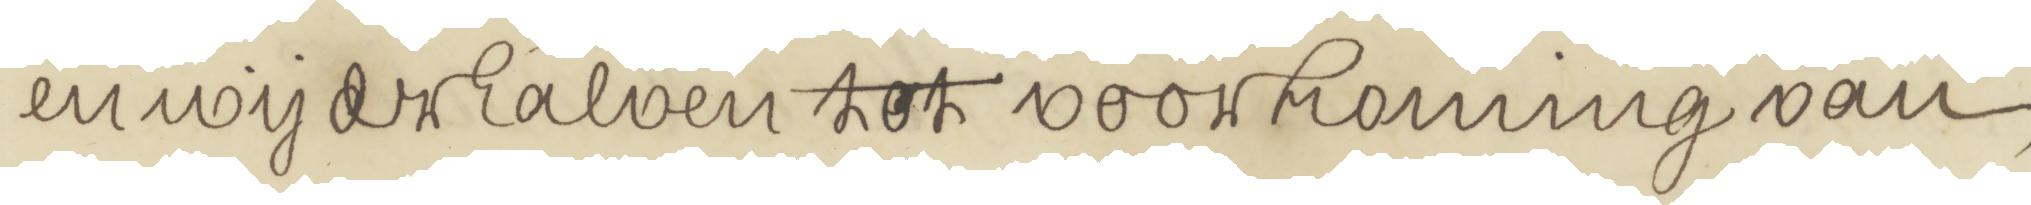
en wij derhalven tot voorkoming van
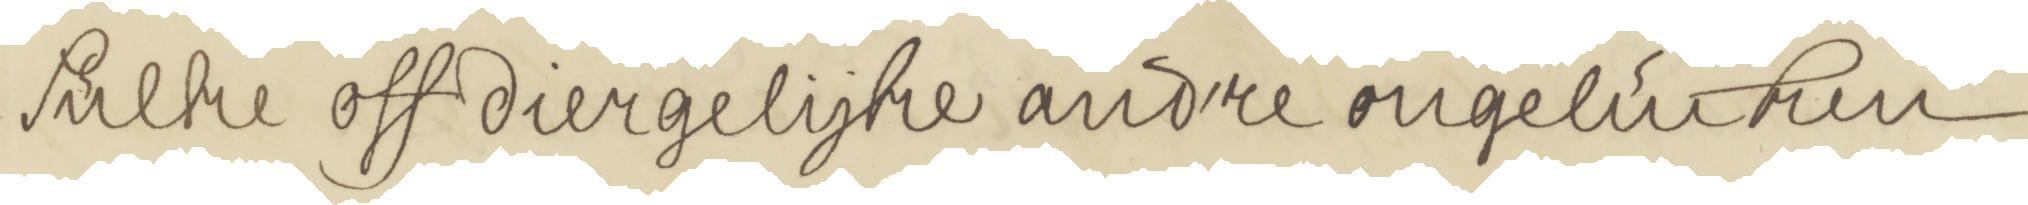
sulke off diergelijke and're ongelucken
